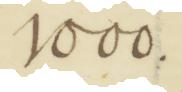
1000.
